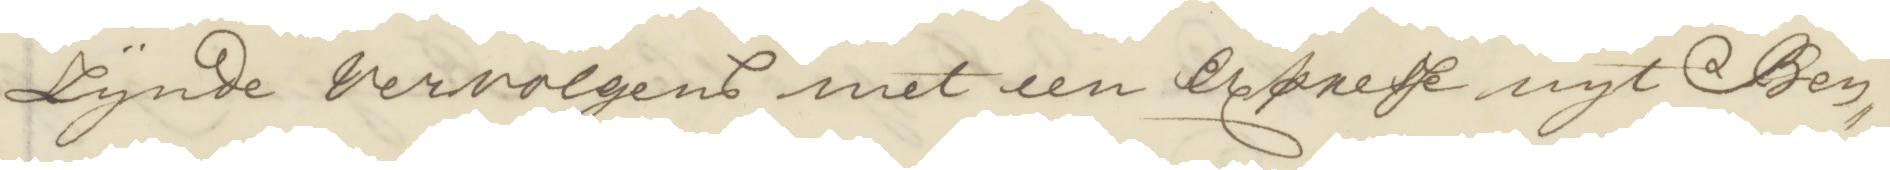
zijnde vervolgens met een expresse uijt Ben„
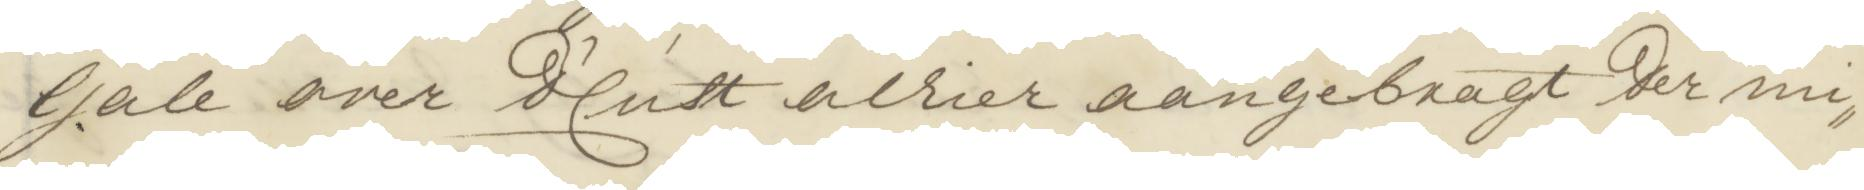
Gale over d'Cust alhier aangebragt der mi„
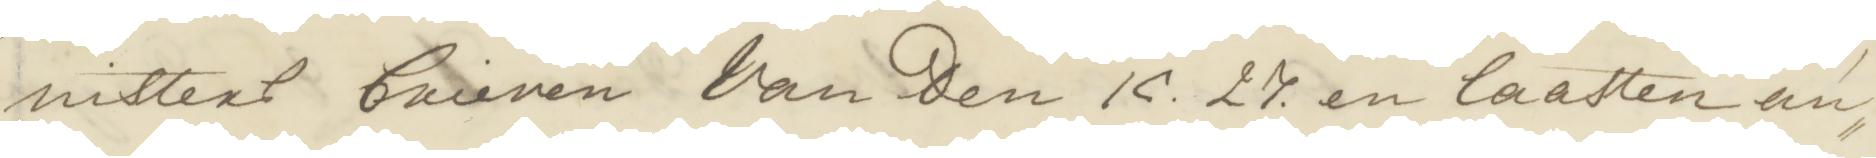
nisters brieven van den 15. 27. en laasten au„
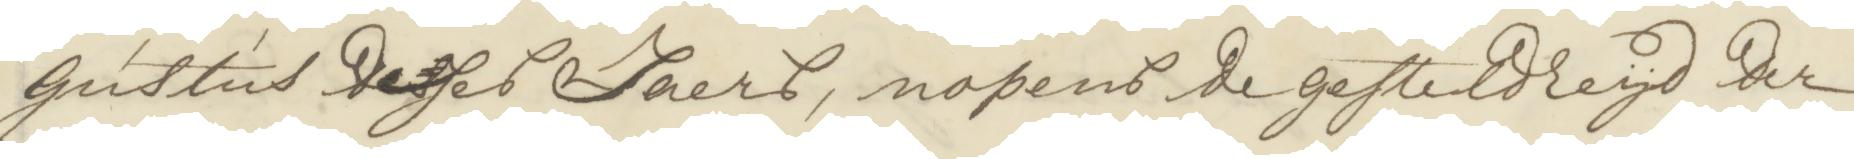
gustus desses Jaers, nopens de gesteldheijd der
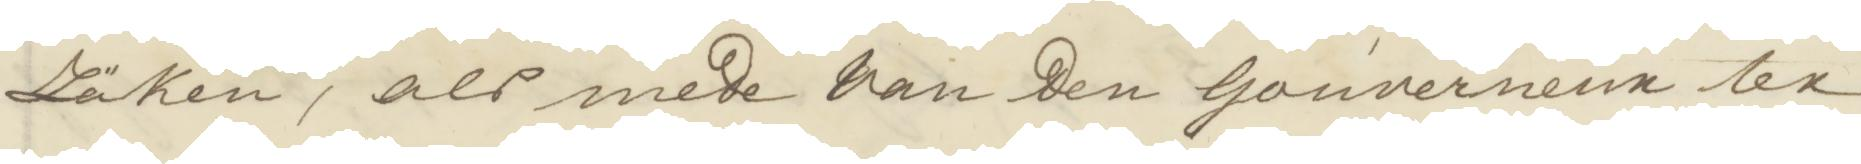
zäken, als mede van den gouverneur ter
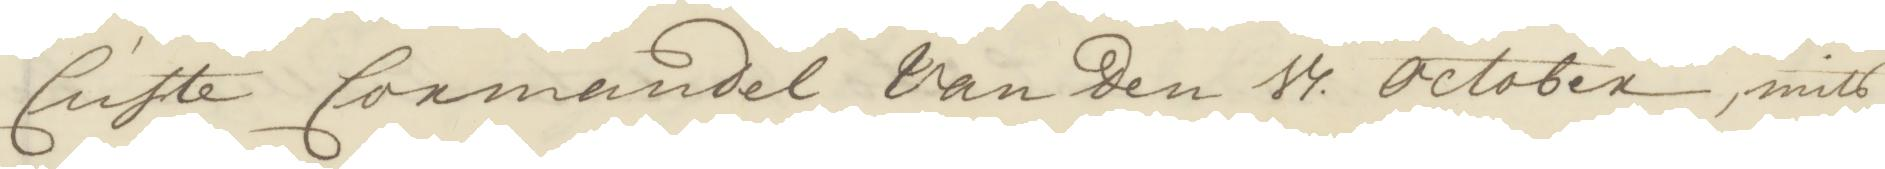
Custe Cormandel van den 17. october, mits
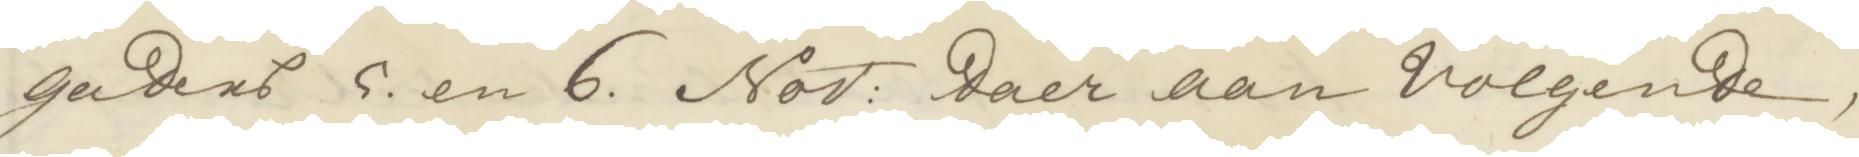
gaders 5. en 6. Nov: daer aan volgende,
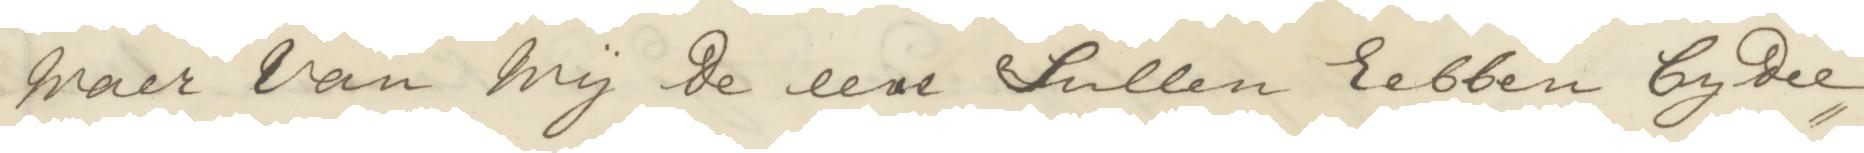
waer van mij de een sullen hebben bij dee„
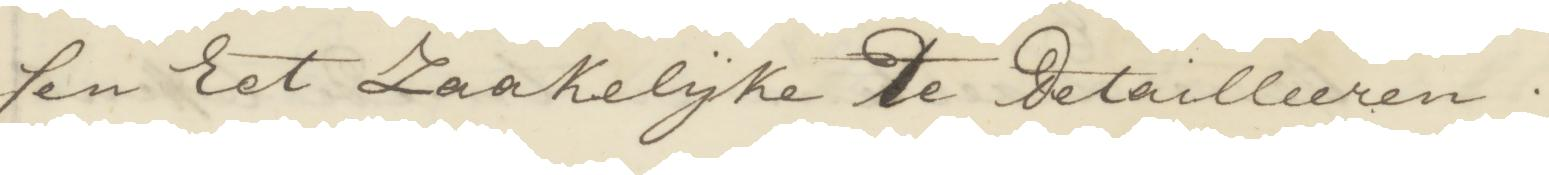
sen het zaakelijke te detailleeren .
